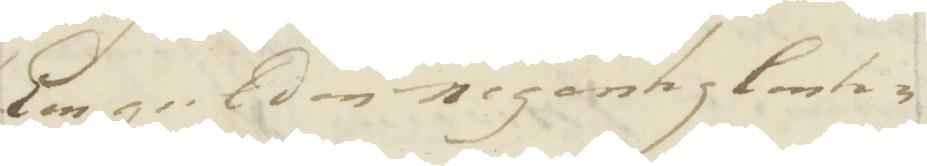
Een gulden negentig Cent „
